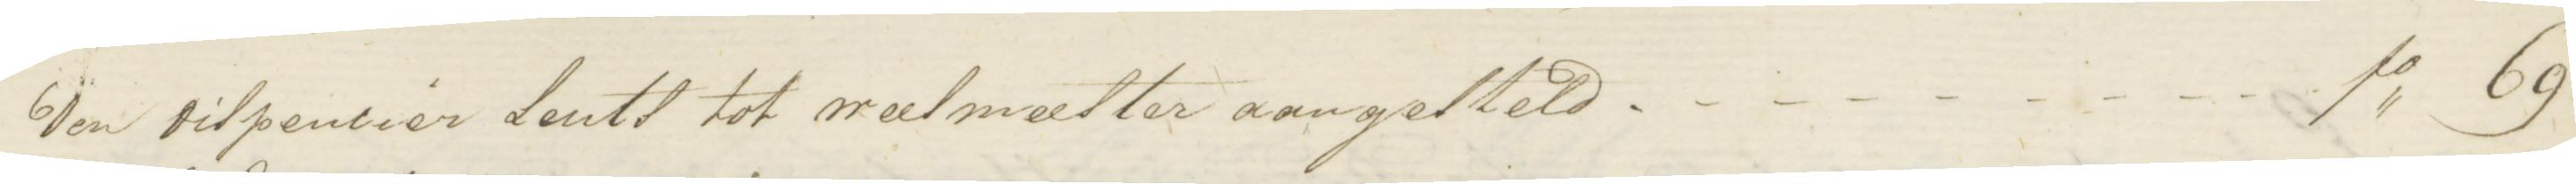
den dispencier Lents tot weesmeester aangesteld - – – – – – – – – - f„o 69
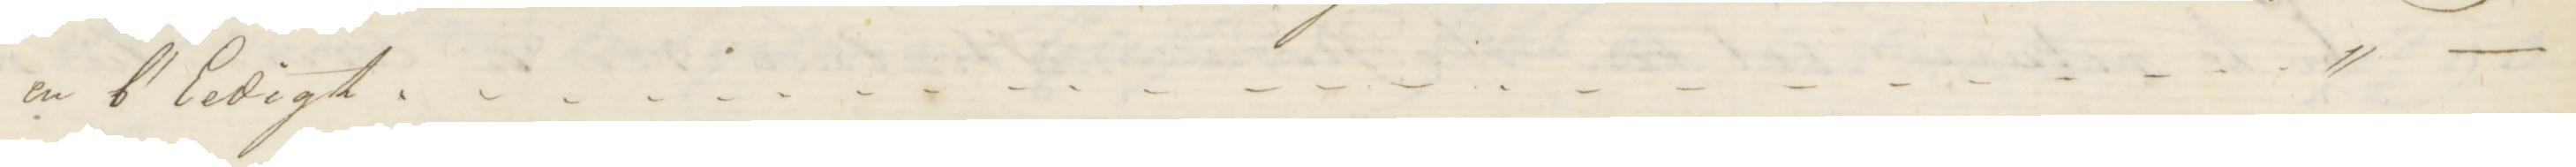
en b' Eedigt - – - - - - - - - - – – – – - – – – – – – – - - „ —
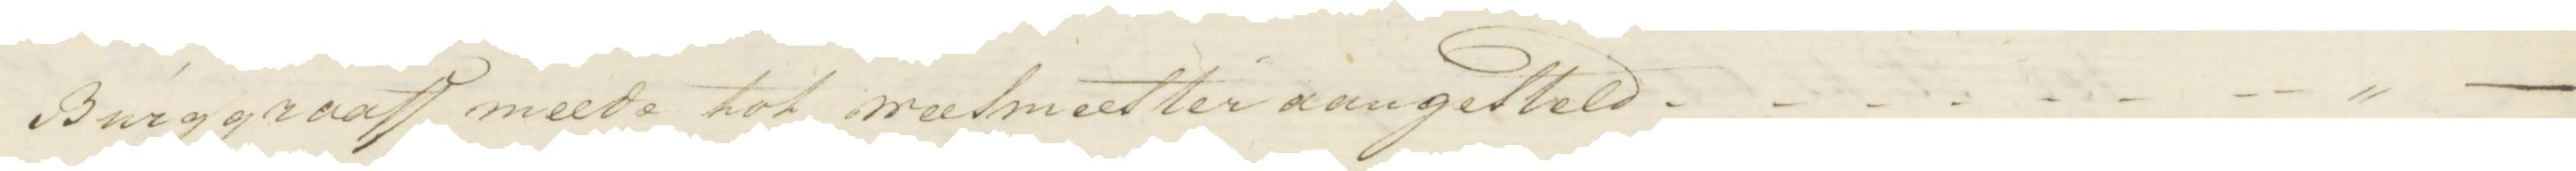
Burggraaff meede tot weesmeester aangesteld - – – - - – – – „ —
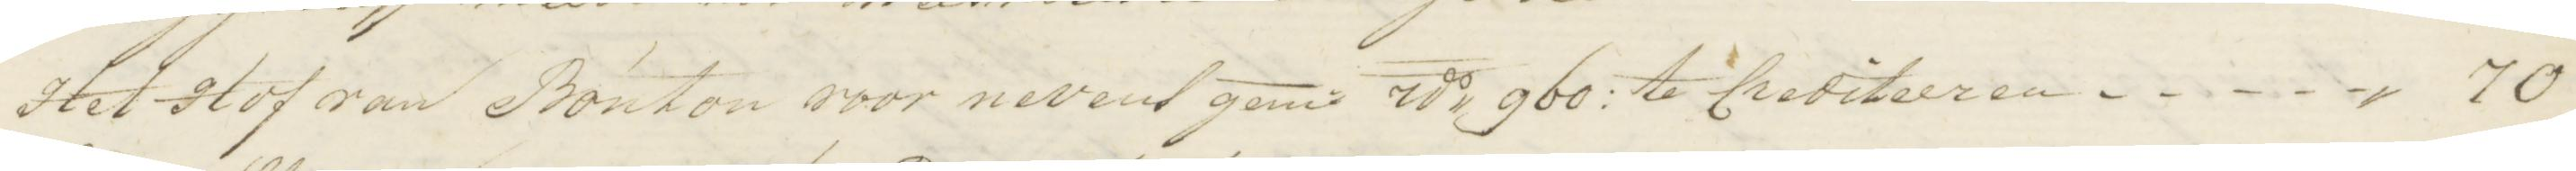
Het Hof van Bouton voor nevens gem= rd„o 960: te Crediteeren – – – – – „ 70
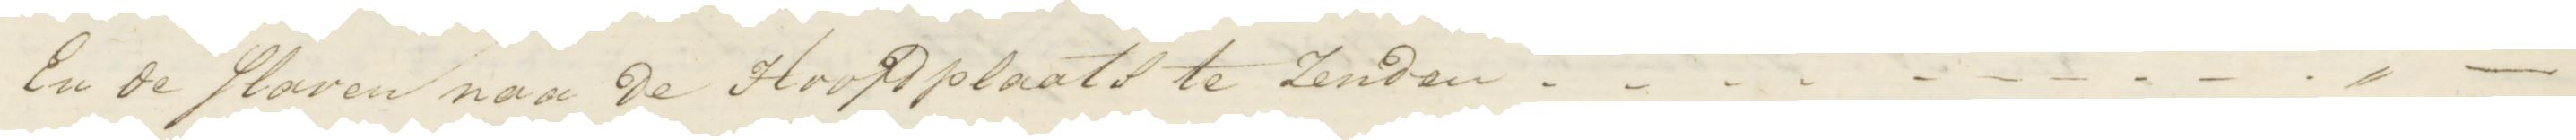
En de slaven naa de Hoofdplaats te zenden - – - - – – – - – - „ —
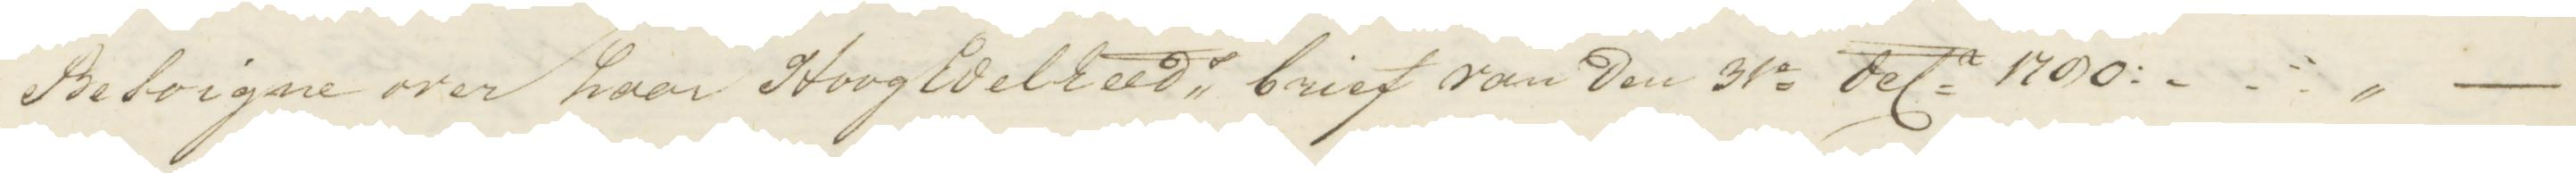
Besoigne over haar Hoog Edelheed„s brief van den 31=e deC=r 1780: - - - „ —
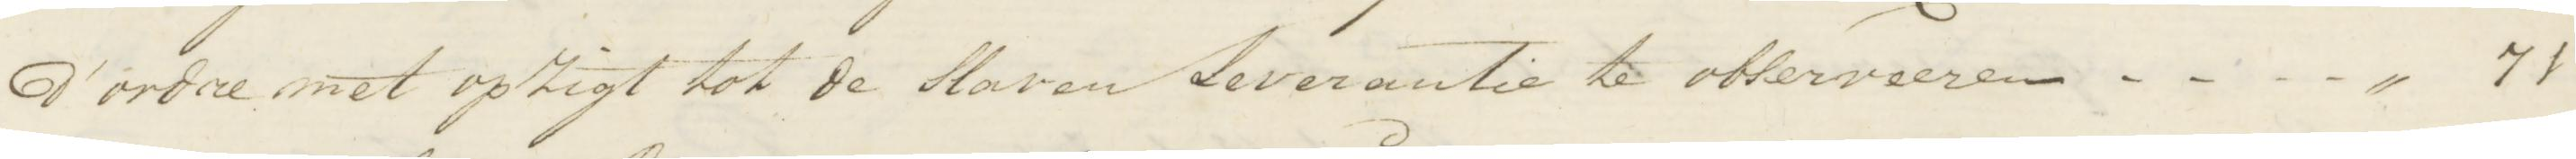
d’ ordre met opzigt tot de slaven leverantie te observeeren – – - - „ 71
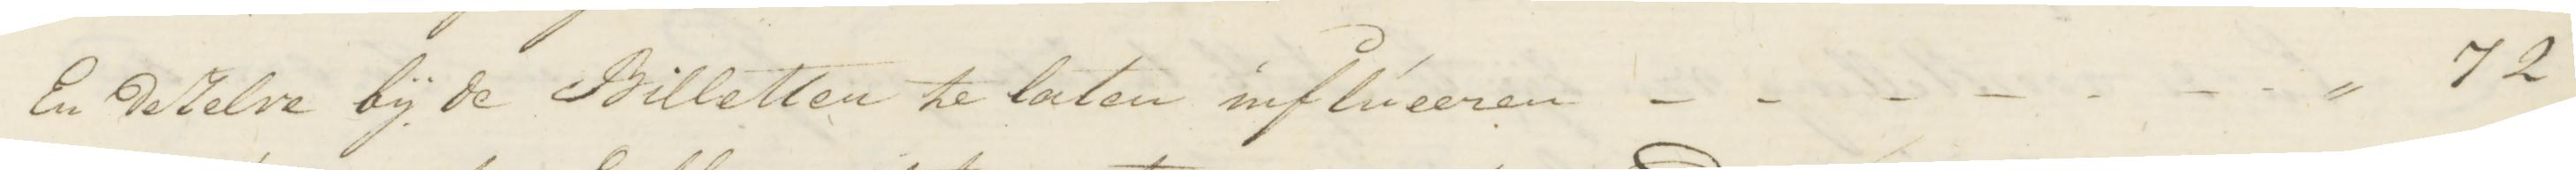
En dezelve bij de Billetten te laten influeeren – – - – - – - „ 72
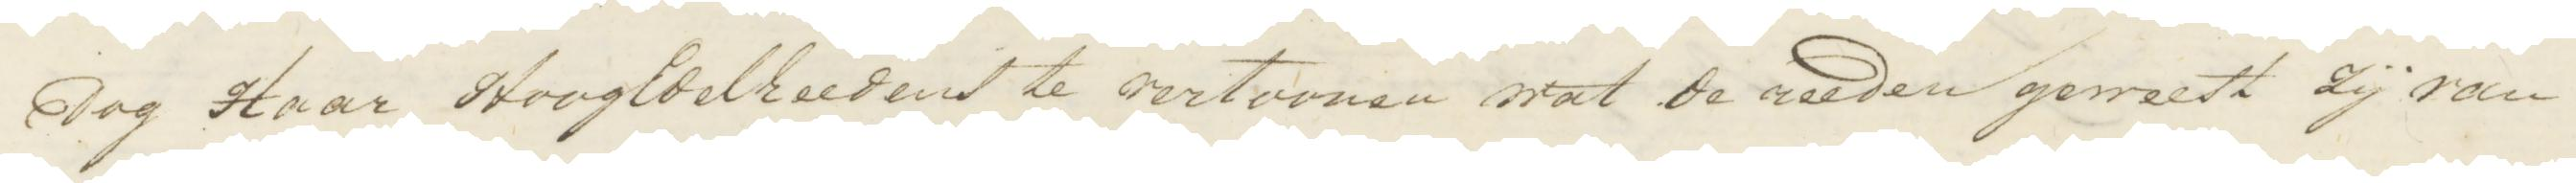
dog Haar Hoog Edelheedens te vertoonen wat de reeden geweest zij van
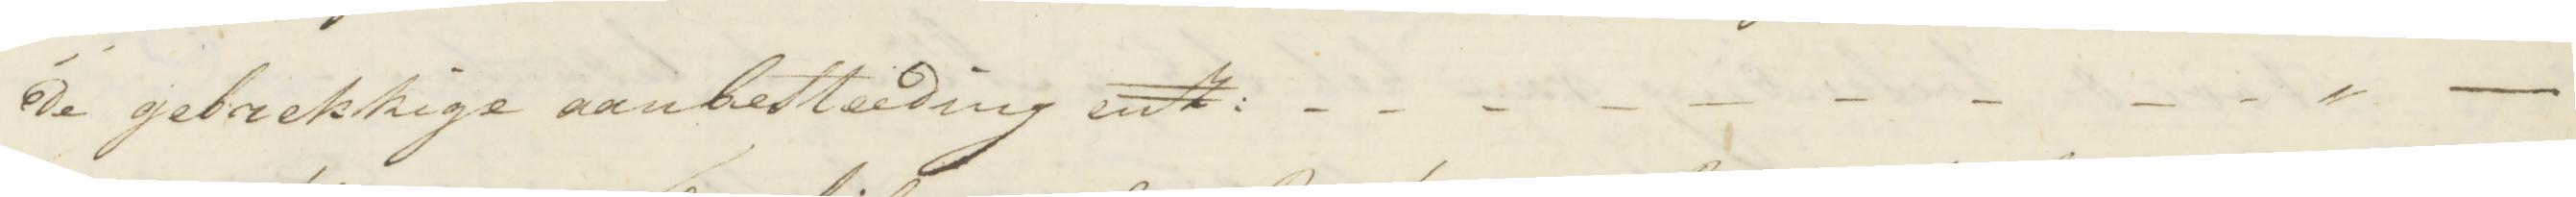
de gebrekkige aanbesteeding enz: – – – – – – – – – „ —
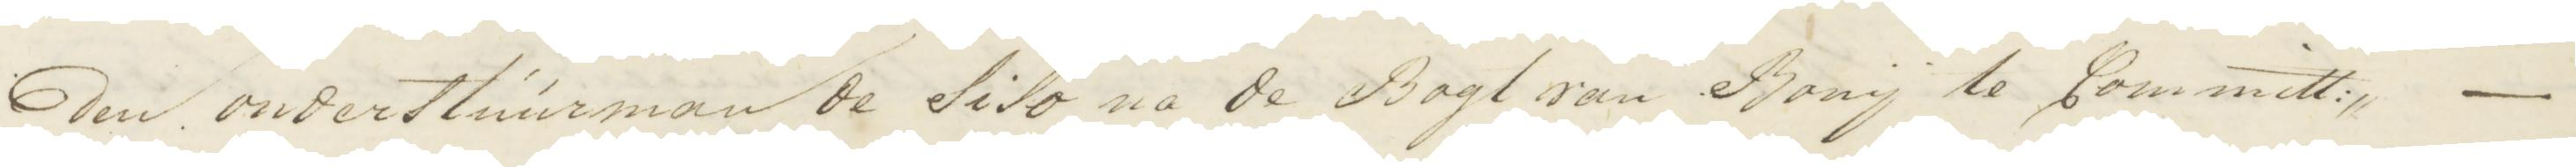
den onderstuurman de siso na de Bogt van Bonij te Committ:„ —
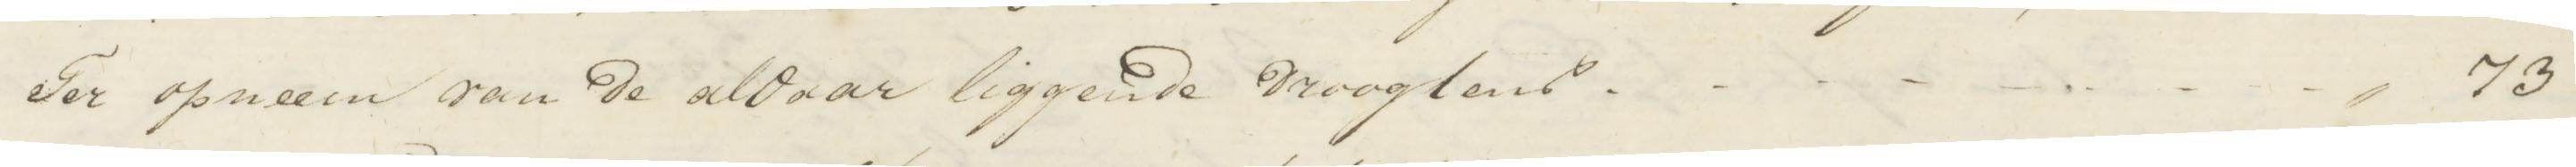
Ter opneem van de aldaar liggende droogtens - - - – – - - – – „ 73
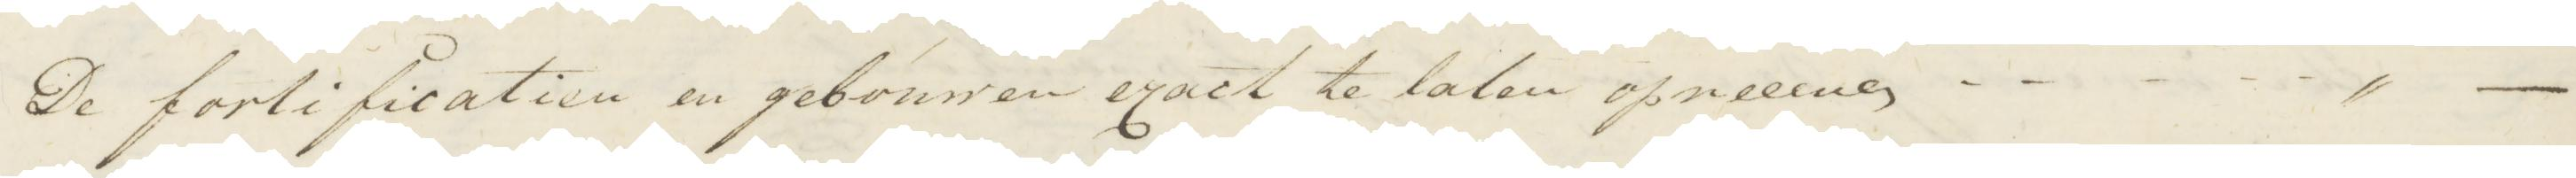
De fortificatien en gebouwen exact te laten opneemen – – – – – „ —
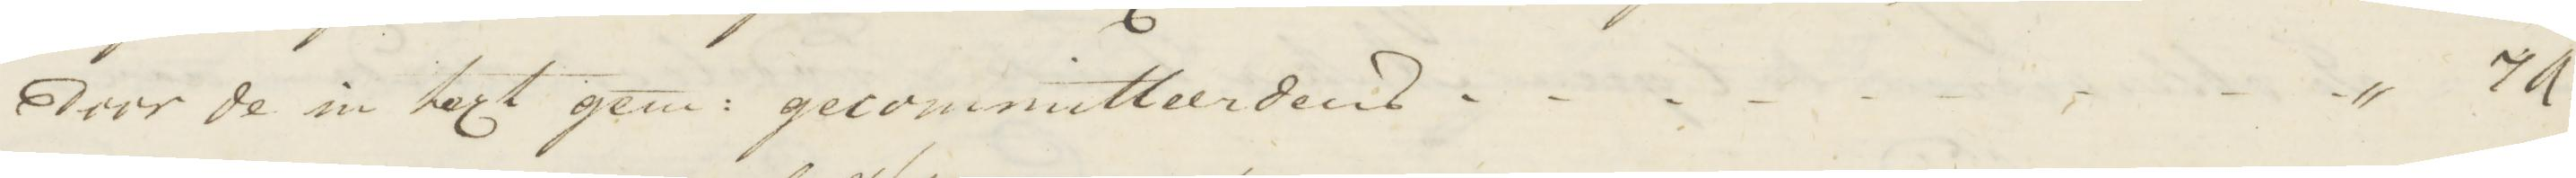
door de in text gem: gecommitteerdens - – – – - – - – –„ 74
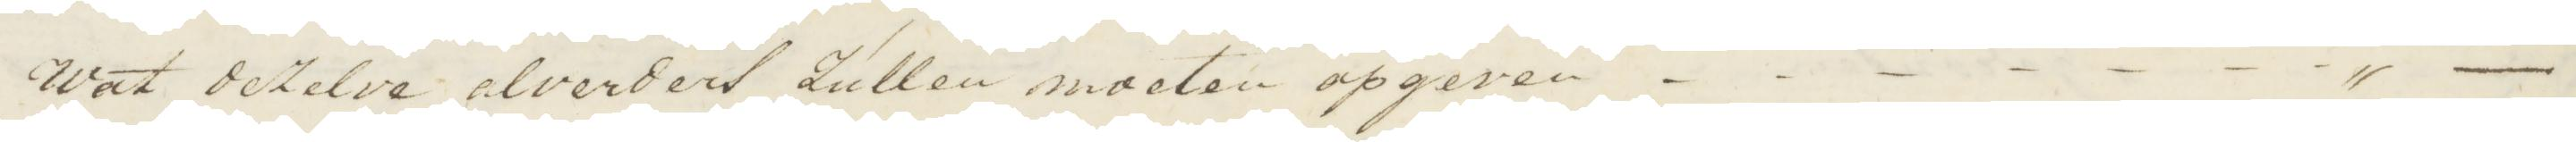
wat dezelve alverders zullen moeten opgeven – - – – – – - „ —
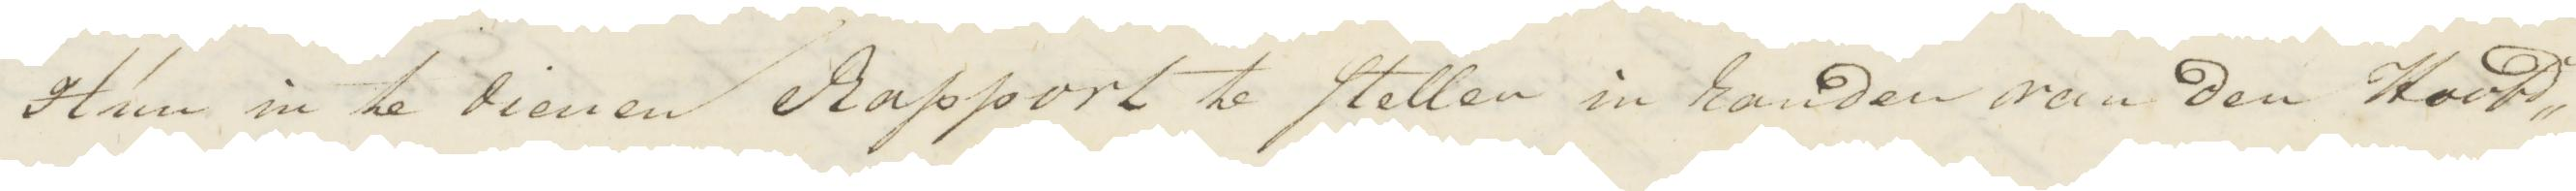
Hun in te dienen Rapport te stellen in handen van den Hoofd„
